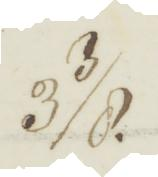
3 3/8.
